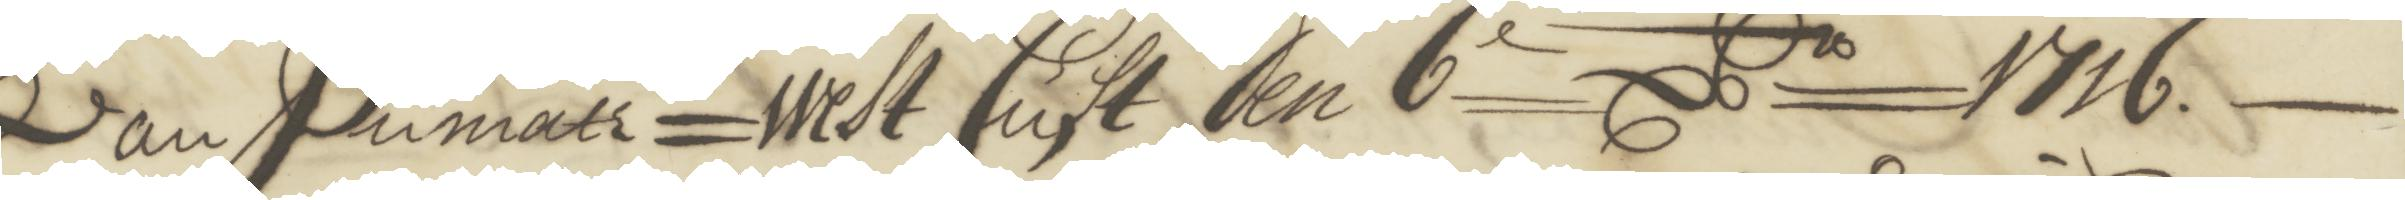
Van Sumatr=s west Cust den 6=e xb=r 1716.—
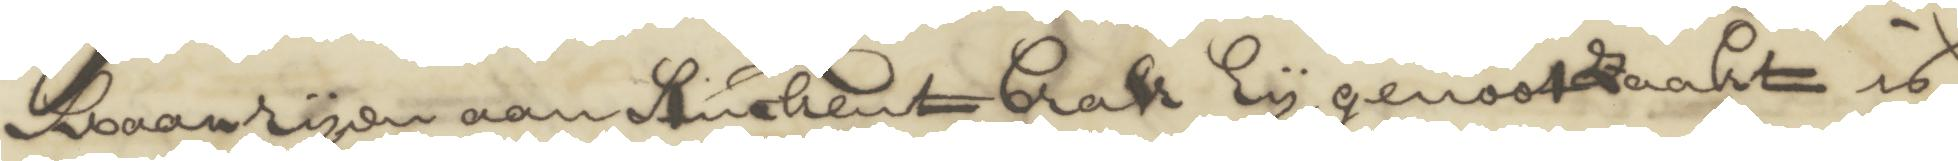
Swaarrijen aan stuckent brak hij genootzaakt is
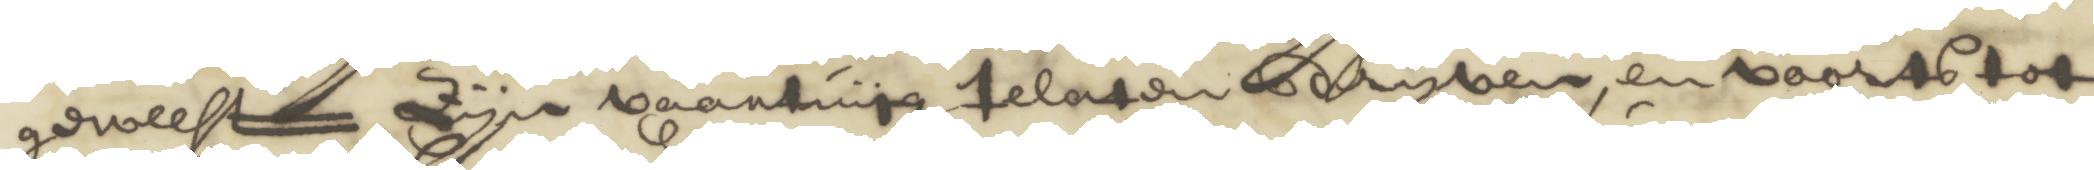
geweest, Zijn vaartuijg telaten drijven, en voorts tot
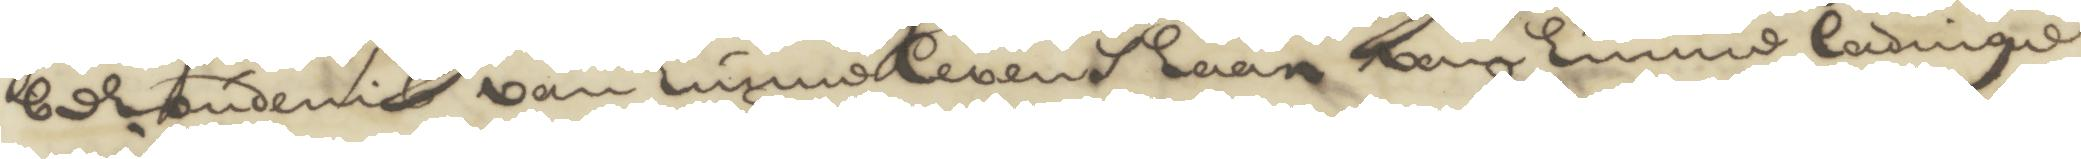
behoudenis van hunne levens haar van hunne ladinge
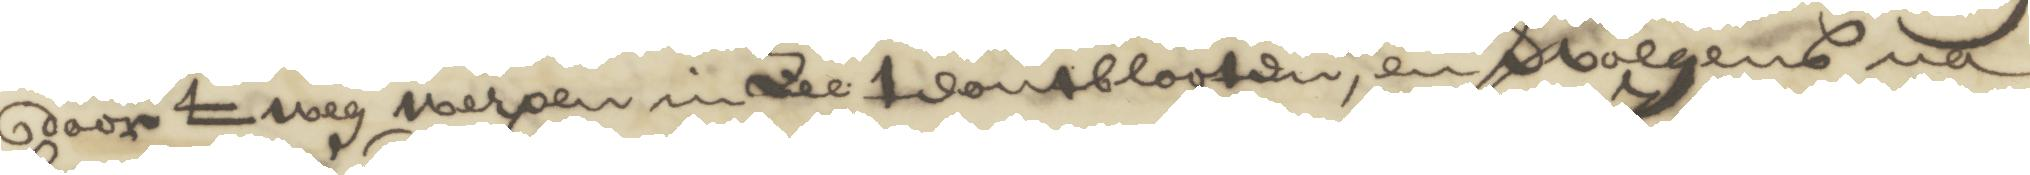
door ’t weg werpen in zee te ontblooten, en vervolgens na
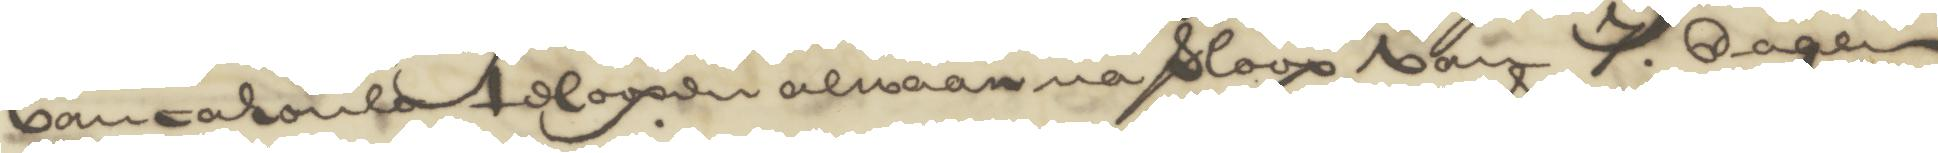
bancahoule teloopen alwaar na verloop van 7. dagen
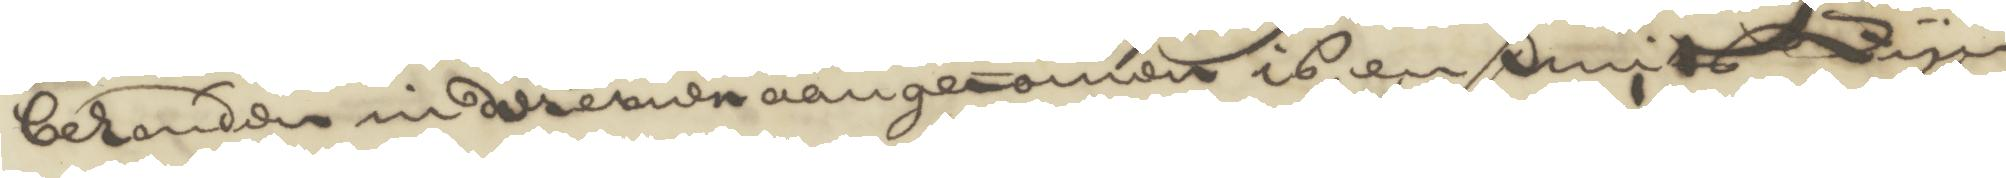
behouden in derevier aan gecomen is, en vermits Zijn
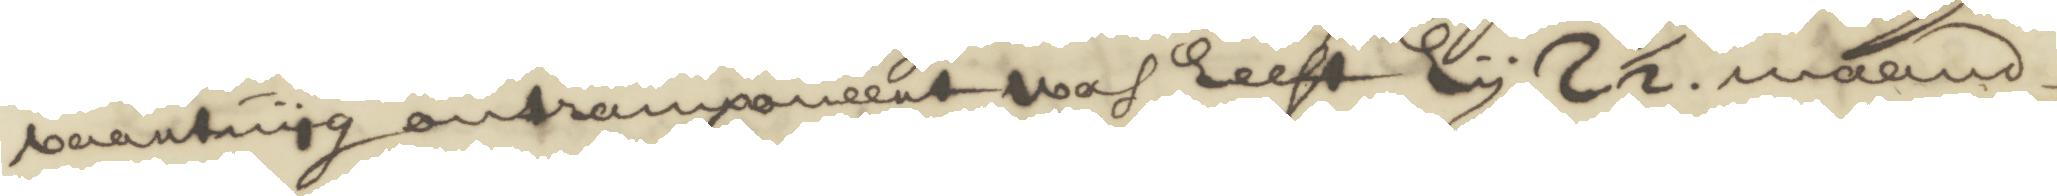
vaartuijg ontramponeert was heeft hij 2½. maand
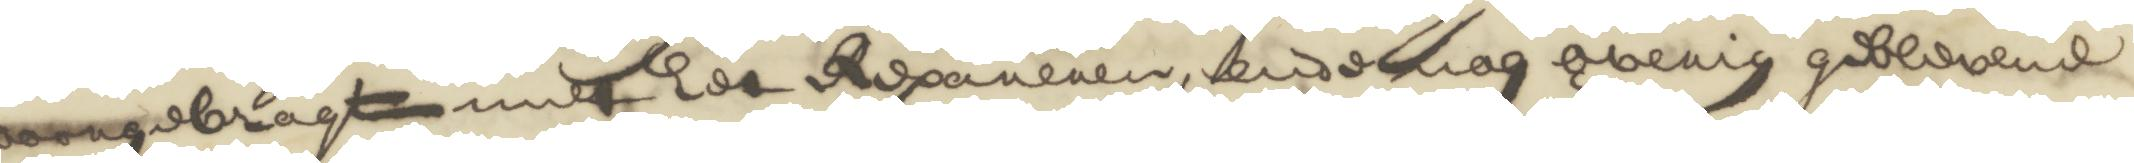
doorgebragt met het Repareren, ende nog overig geblevene
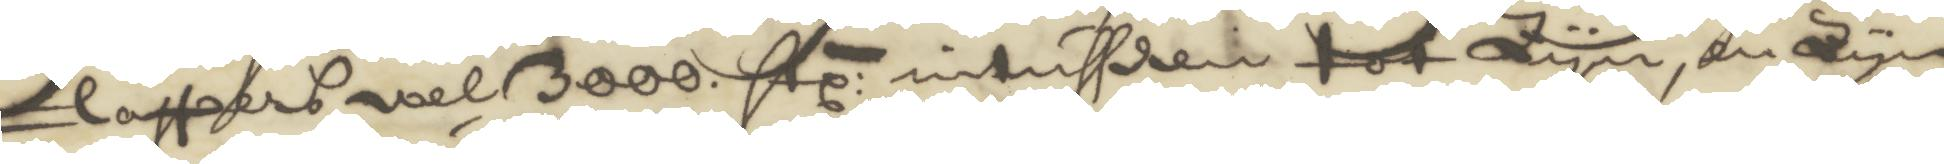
Clappers wel 3000. stx: intussen tot Zijn, en Zijn
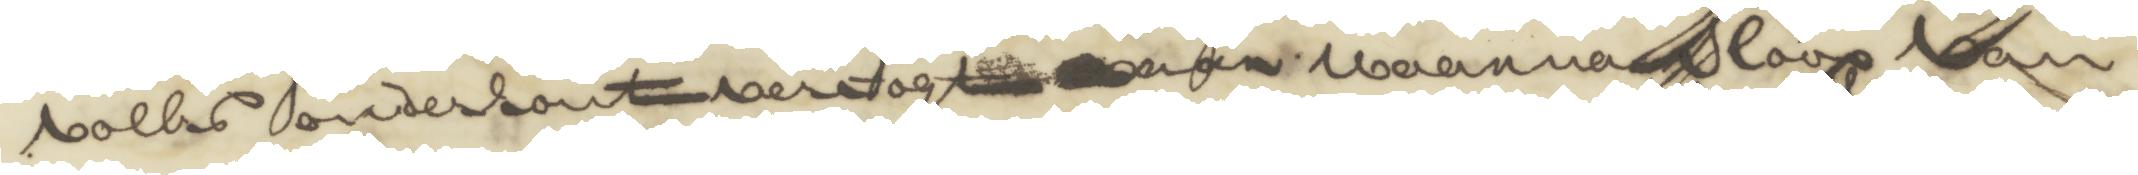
volks onderhout vercogt waar waarna verloop van
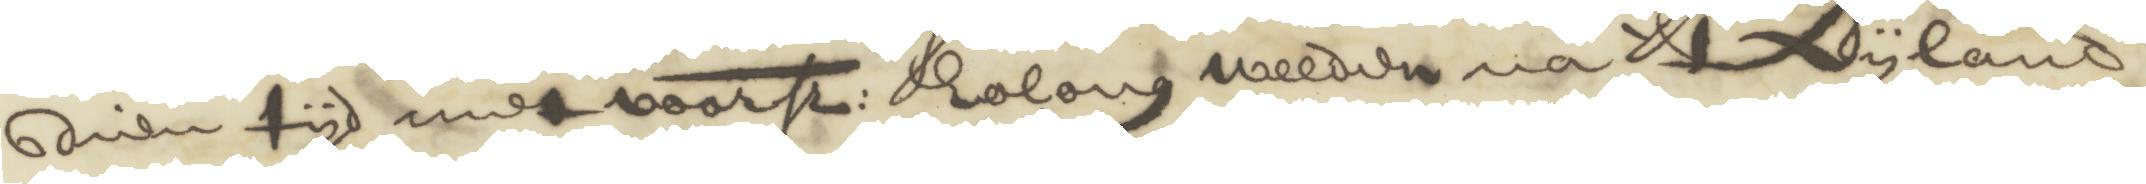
dien tijd met voorst: holong weeder na ’t Eijland
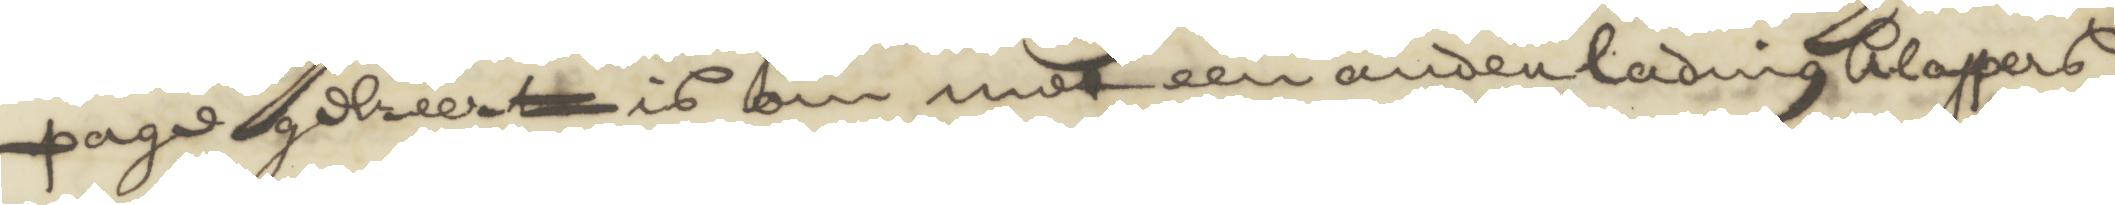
page gekeert is om met een ander lading klappers
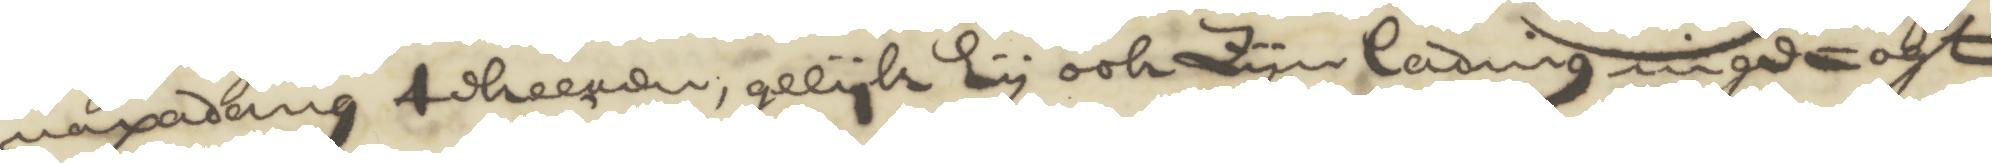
napadang tekeeren, gelijk hij ook Zijn lading ingecogt
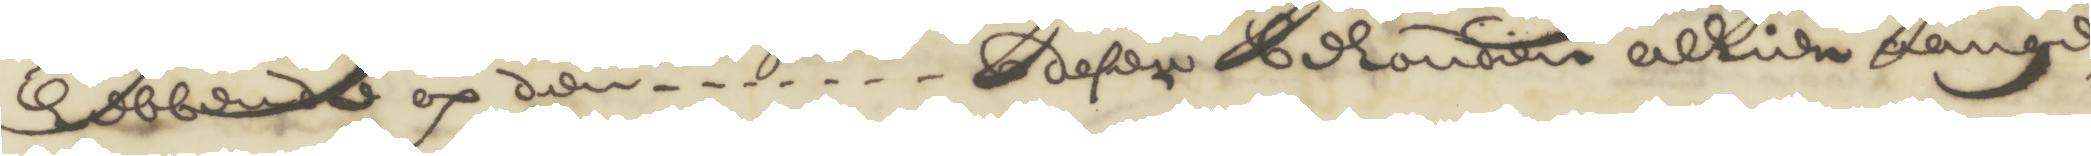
hebbende op den ------ deser behouden alhier aange„
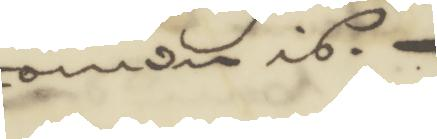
Comen is.
